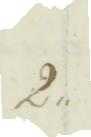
„ 2„
